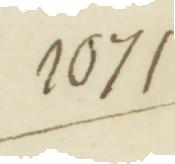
1071
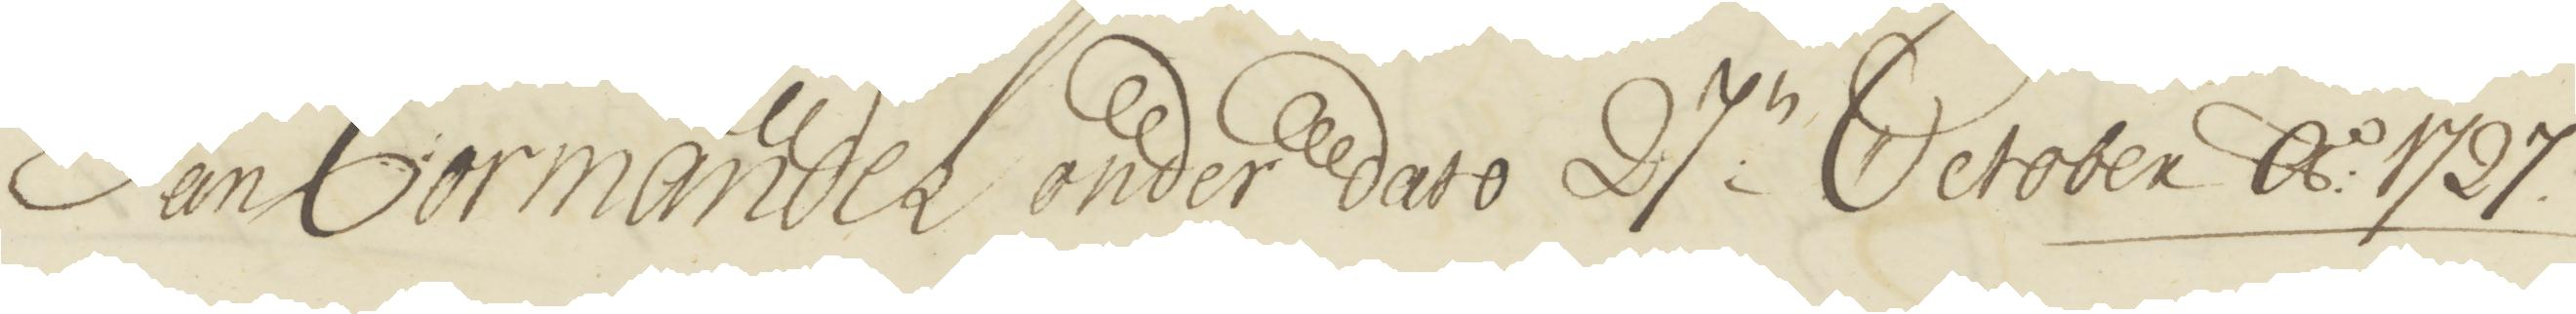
Van Cormandel onder dato 27:e October A:o 1727.
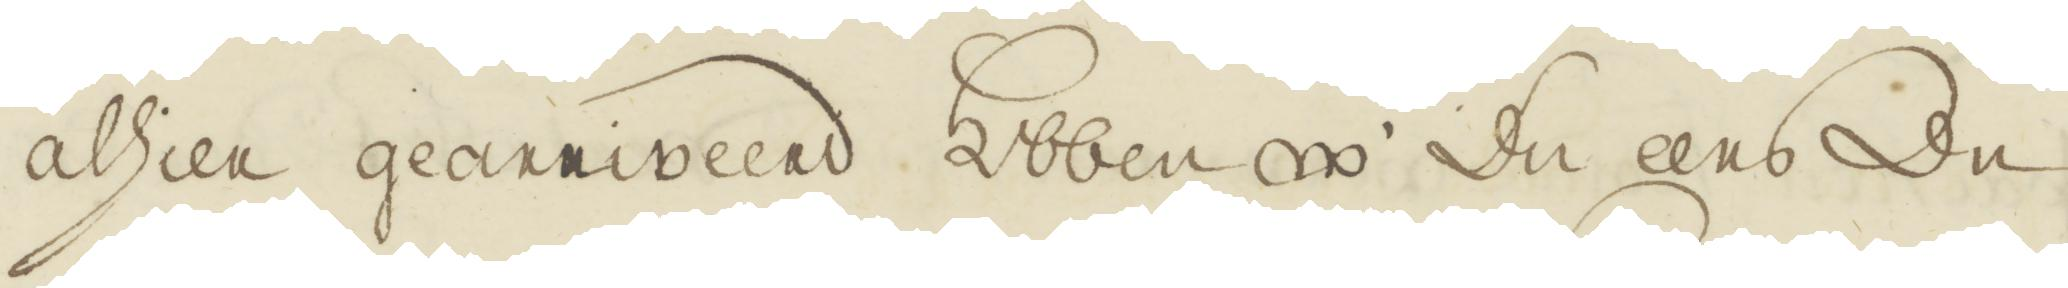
alhier gearriveerd hebben w' ten eersten
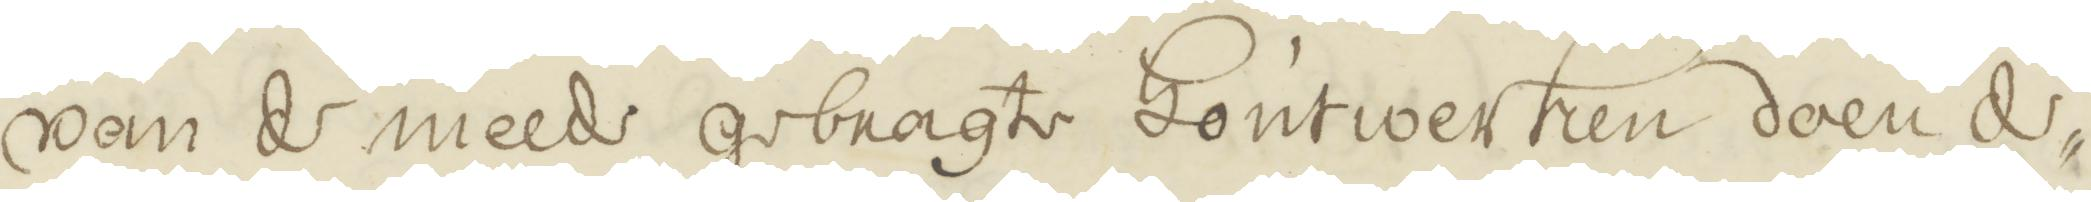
van de meede gebragte houtwerken doen de„
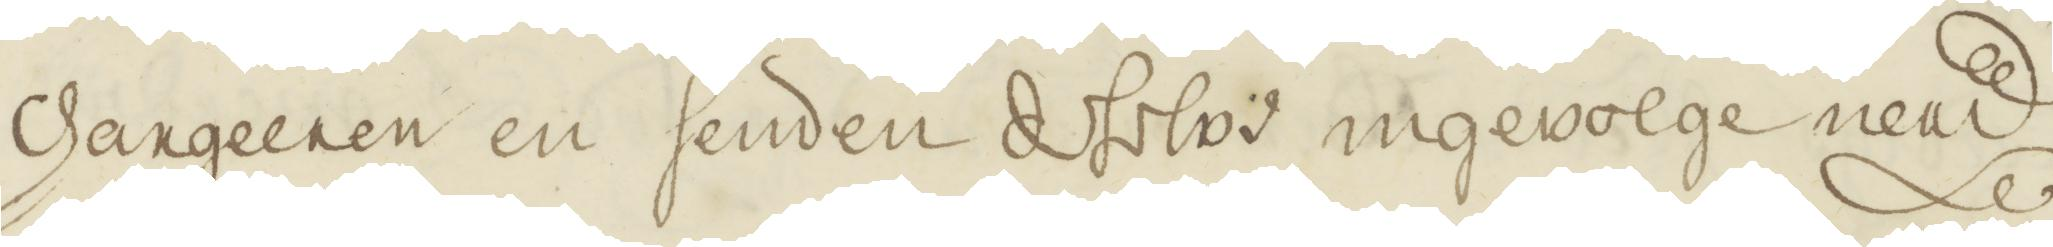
chargeeren en senden deselve ingevolge uer E
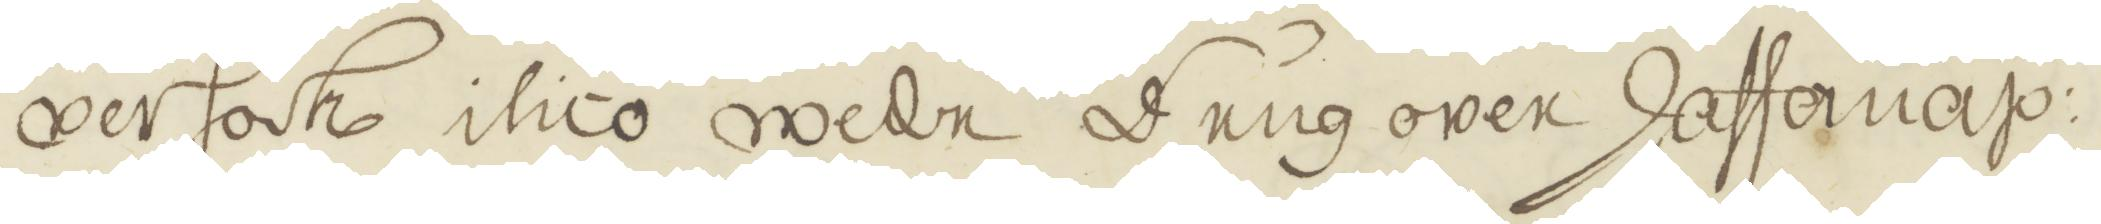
versoek ilico weder te rug over Jaffanap:
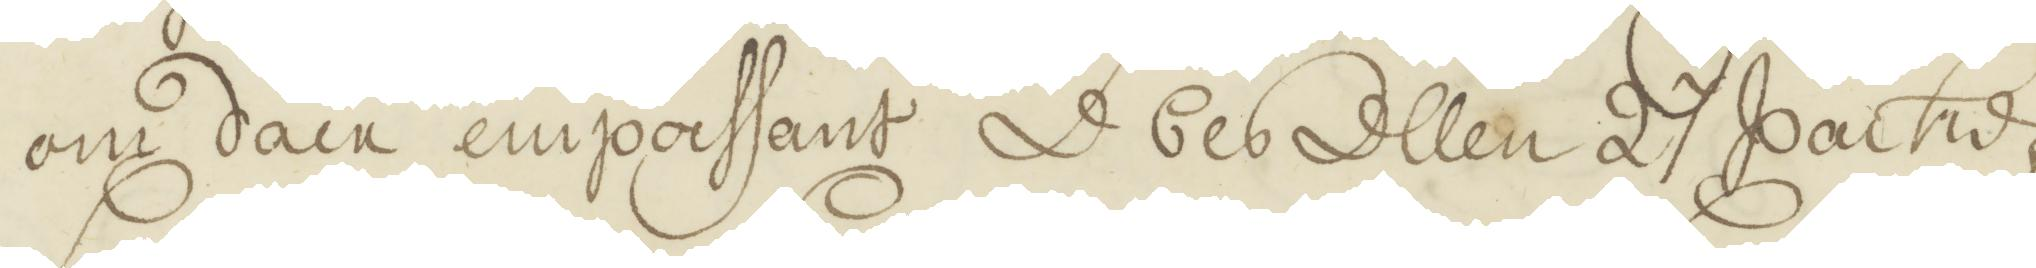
om daer empassant te bestellen 27 packen
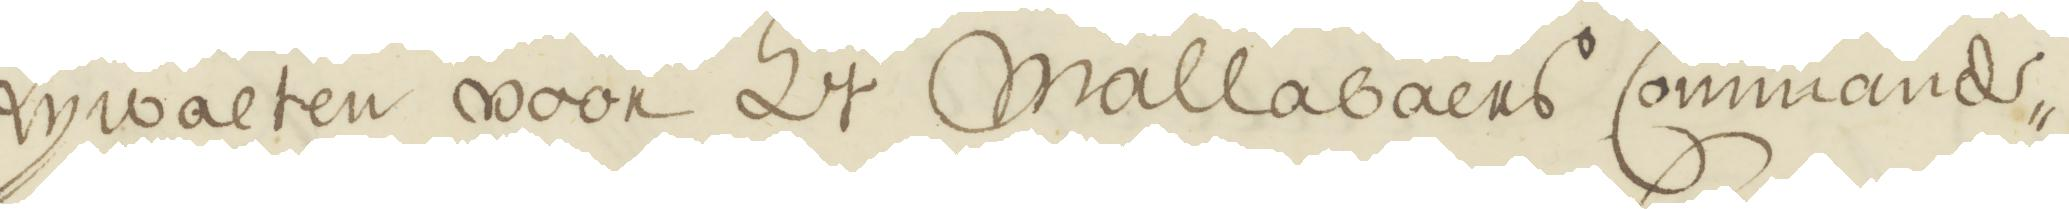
Lywaeten voor het Mallabaers Commande„
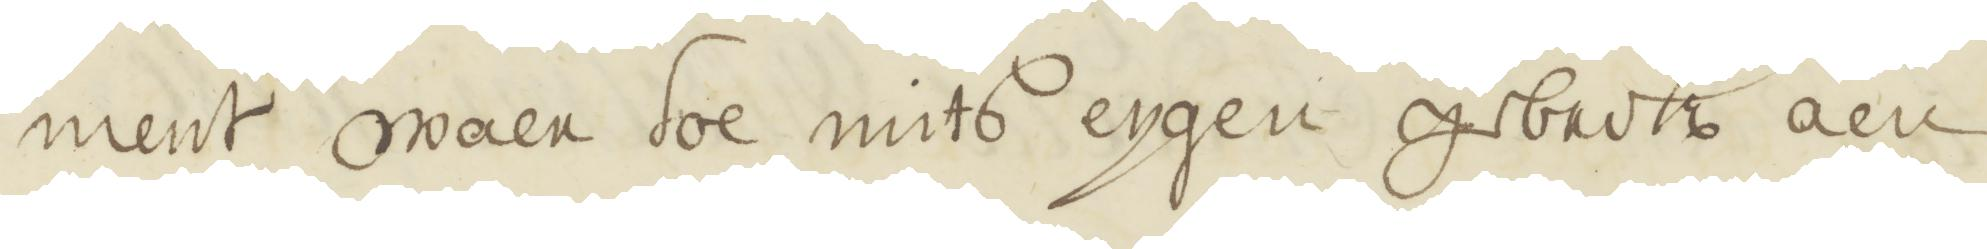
ment waer toe mits eygen gebrek aen
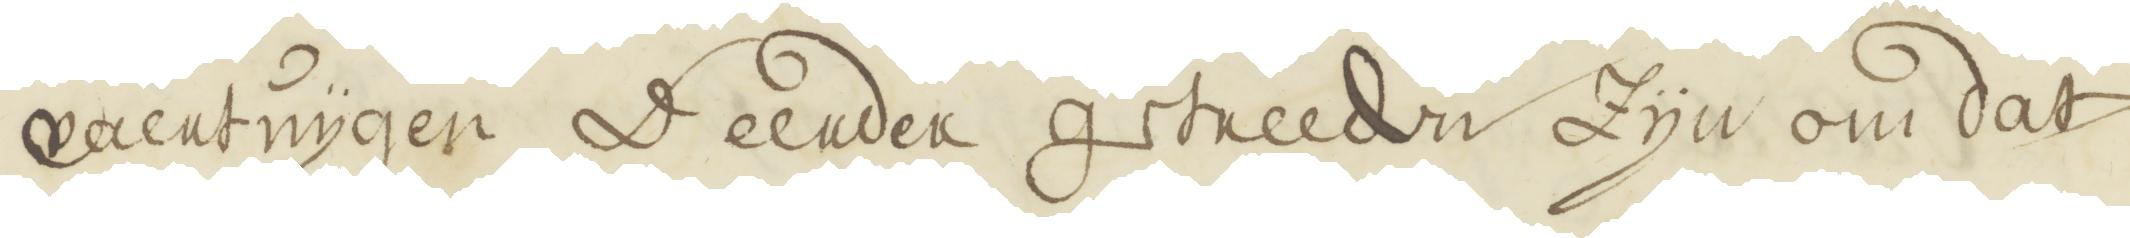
vaertuijgen te eerder getreeden Zijn om dat
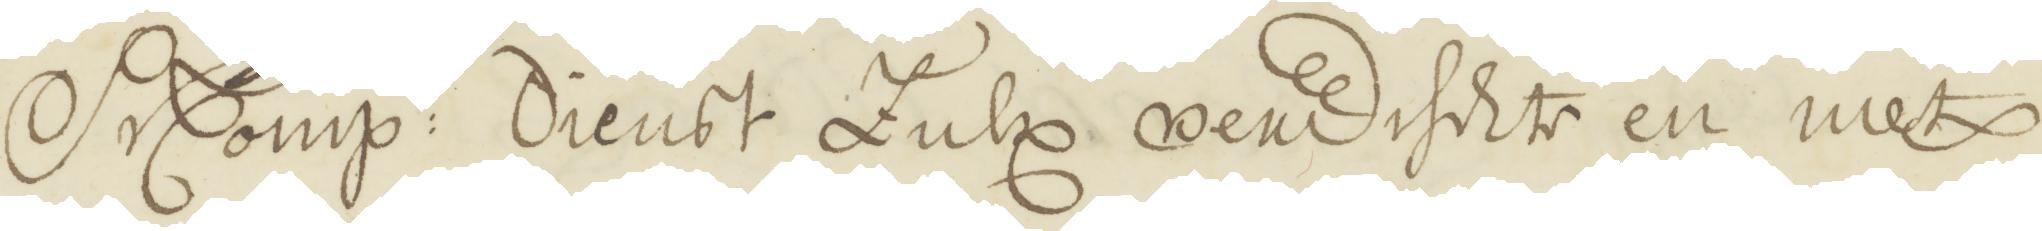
S EComp:s dienst Zulx vereischt en met
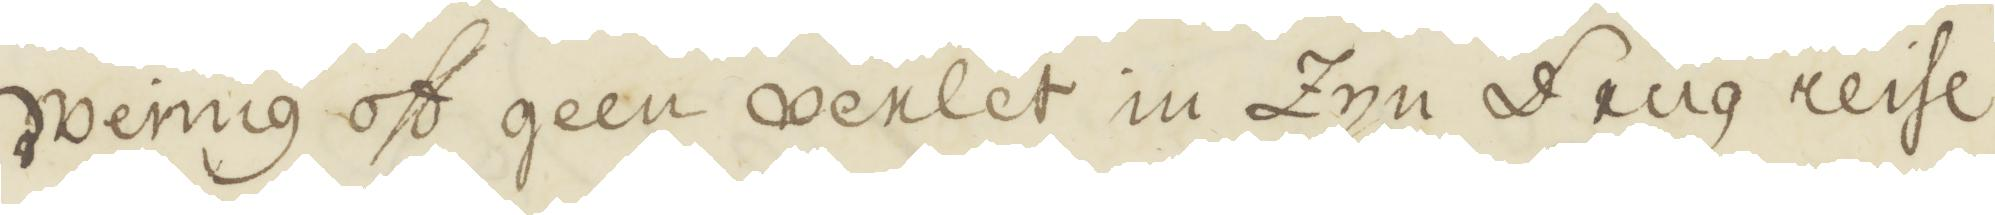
weinig off geen verlet in Zyn te rug reise
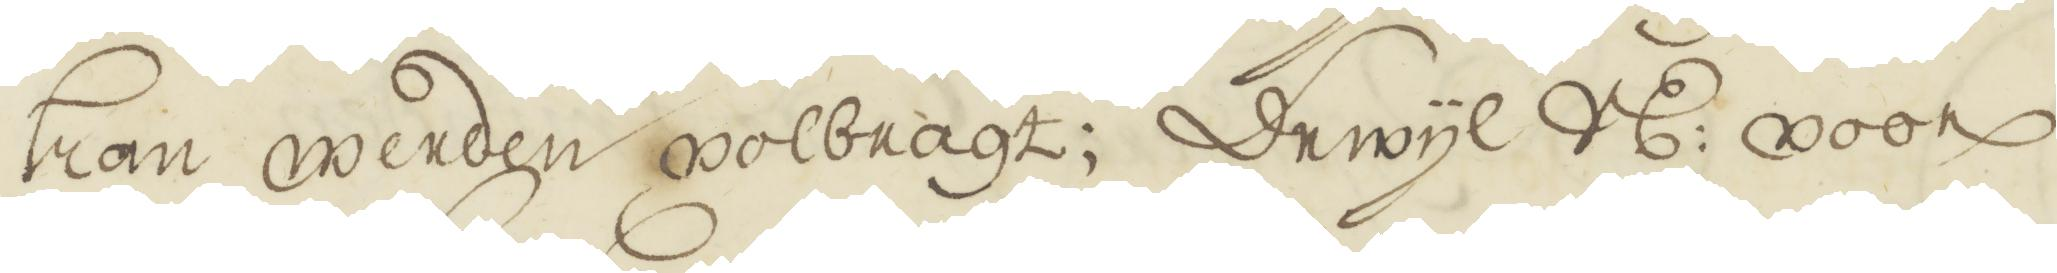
kan werden volbragt; terwijl VE: voor
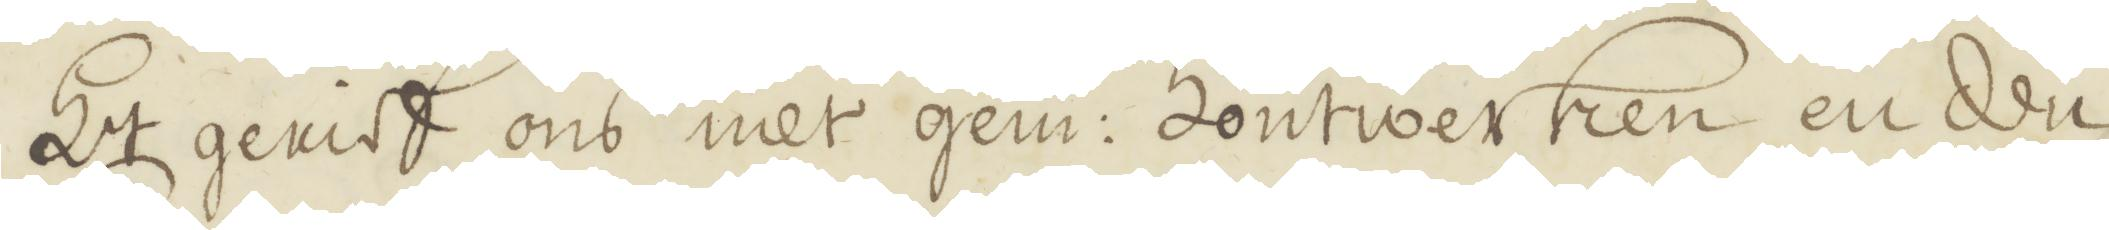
het gerief ons met gem: houtwerken en den
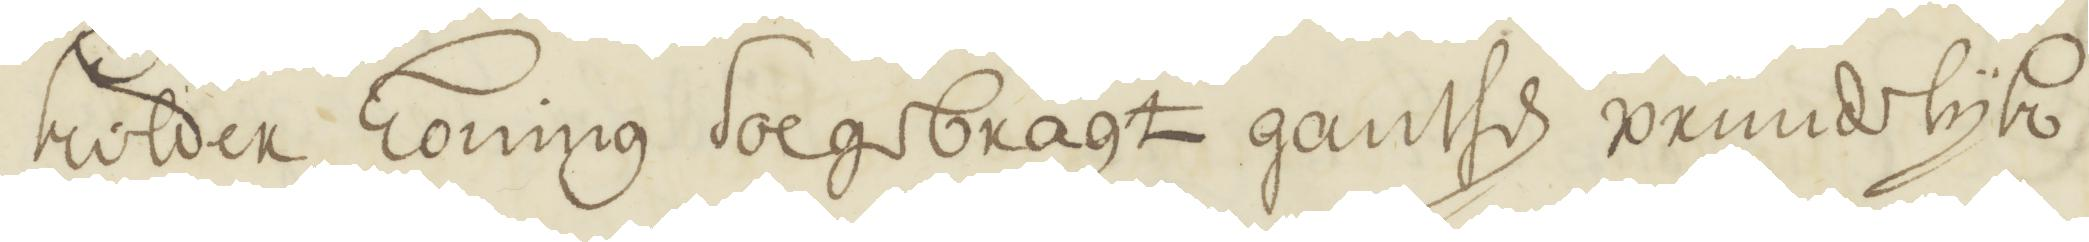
kelder honing toegebragt gantse vrundelijk
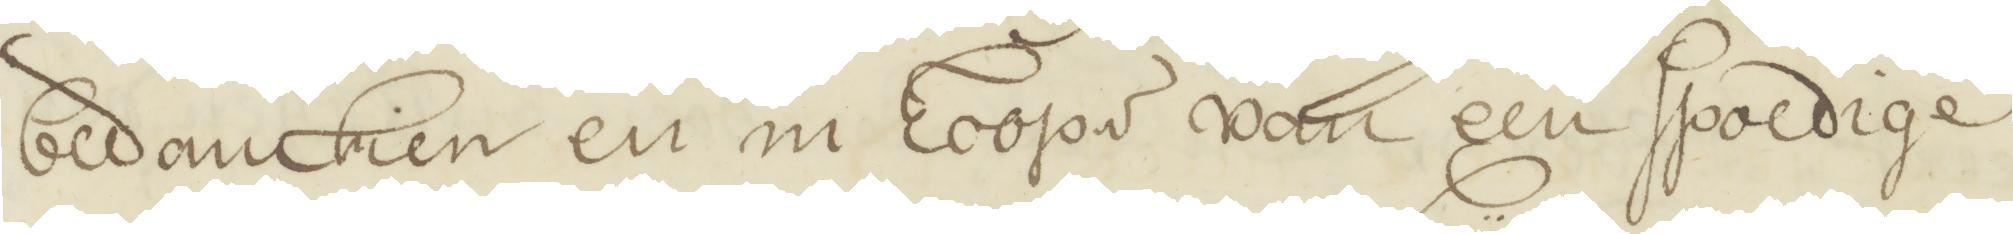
bedancken en in hoope van een Spoedige
